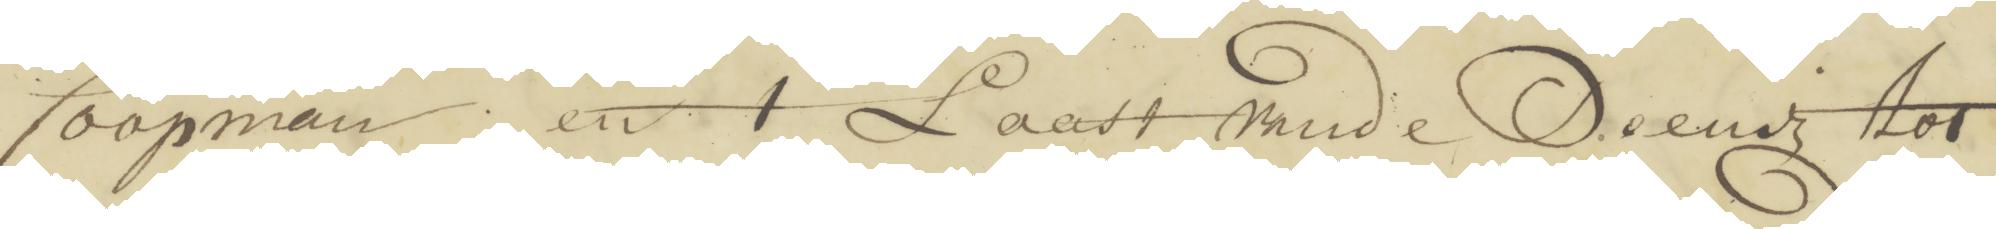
Coopman en t Laast van de Doenen tot
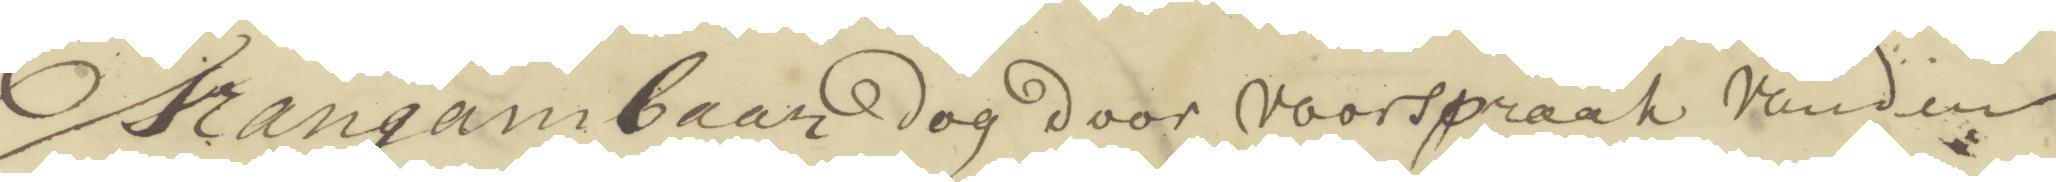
Trangambaar dog door voorspraak van den
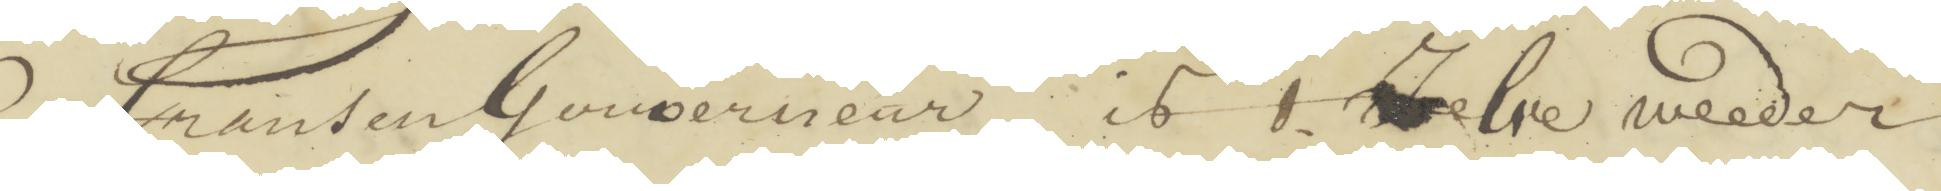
fransen Gouverneur is t zelve weeder
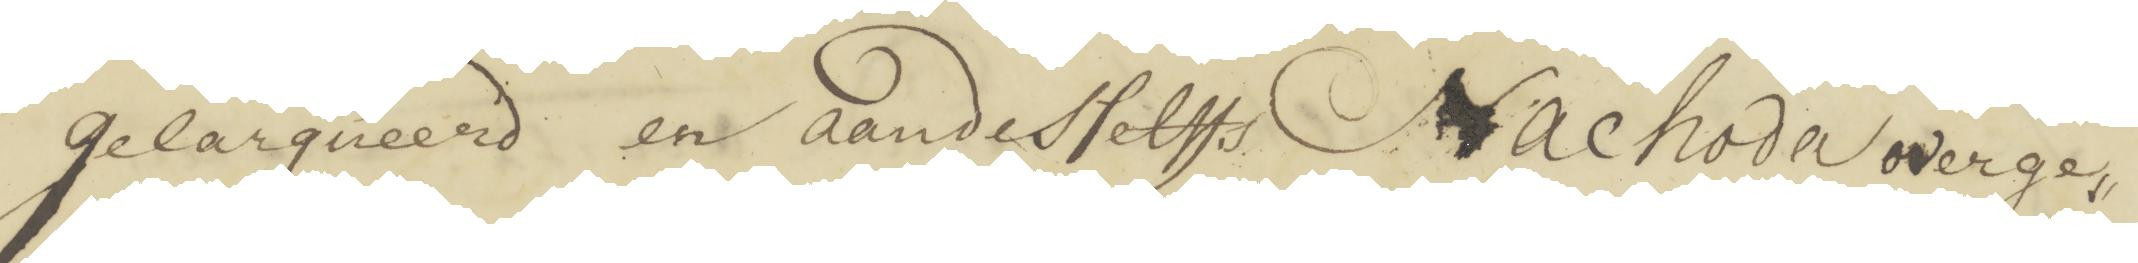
gelargueerd en aan desselffs Nachoda overge„
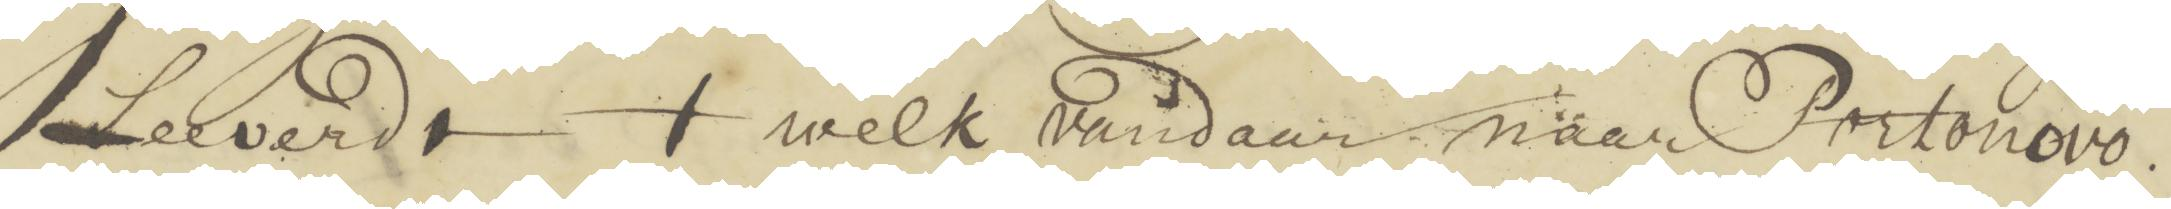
leeverdt t welk van daar naar Portonovo
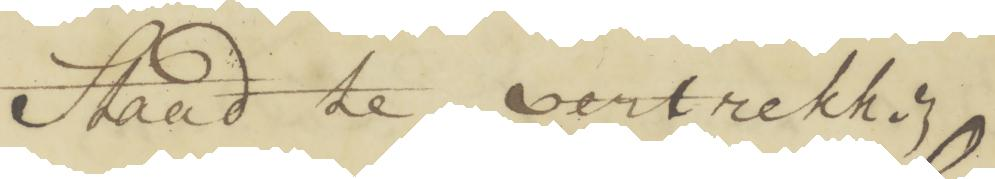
staad te vertrekken
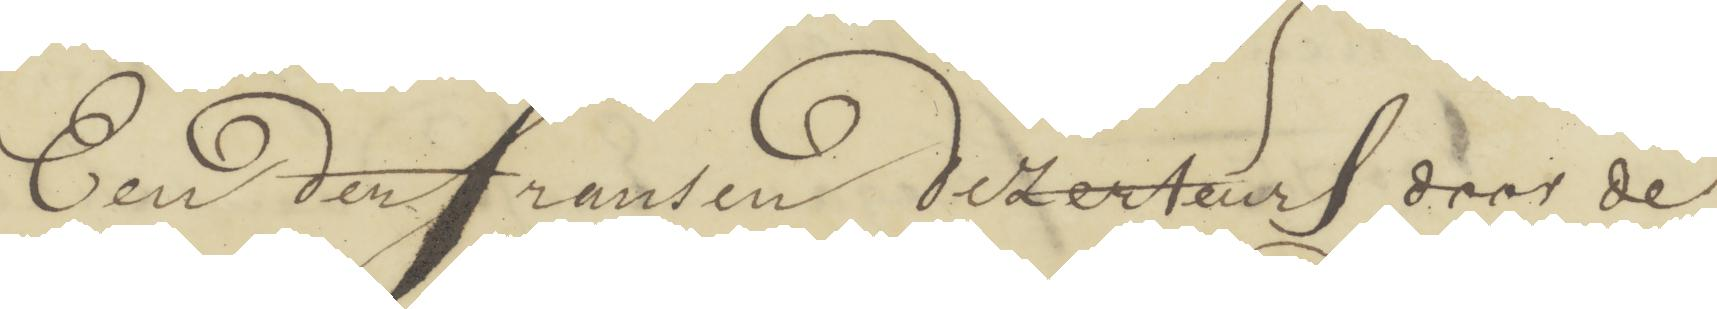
Een der fransen dezerteurs door de
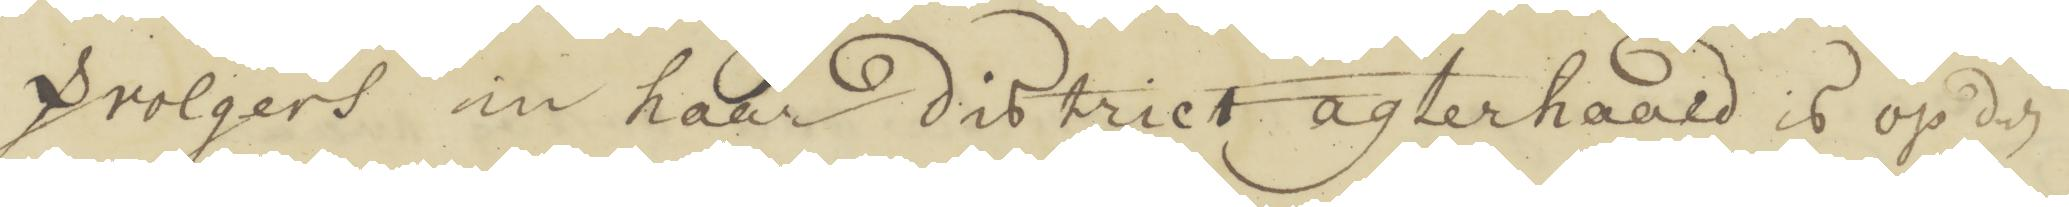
vervolgers in haar district agterhaald is op den
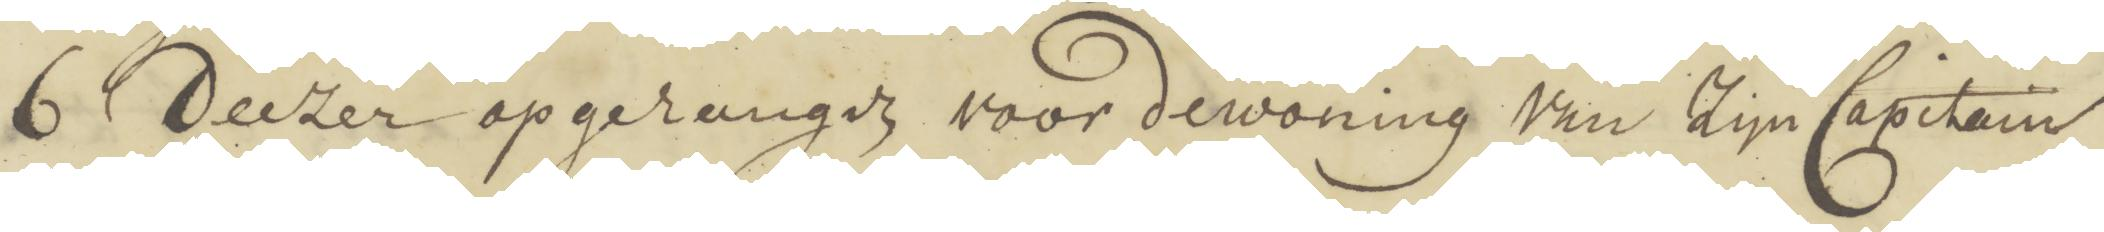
6 deezer opgehangen voor dewoning van zijn Capitain
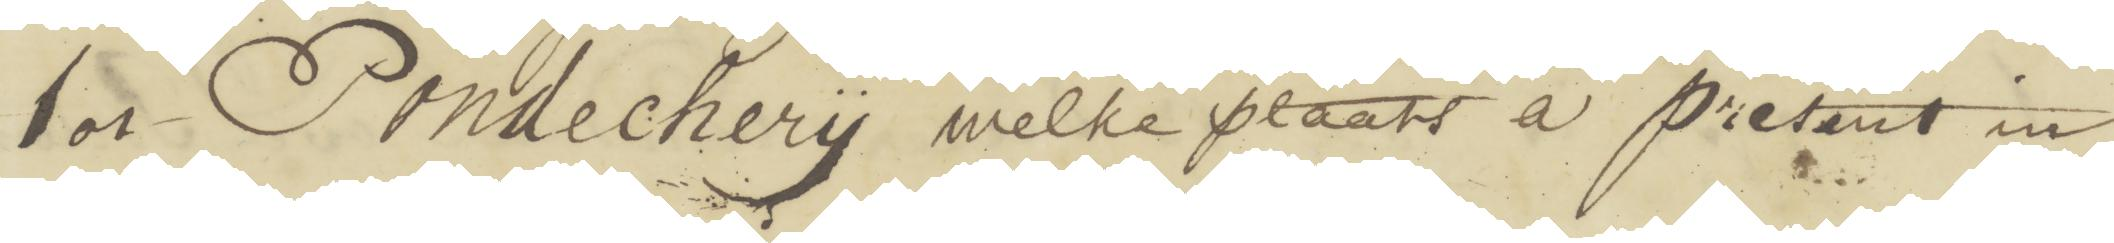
tot Pondecherij welke plaats a present in
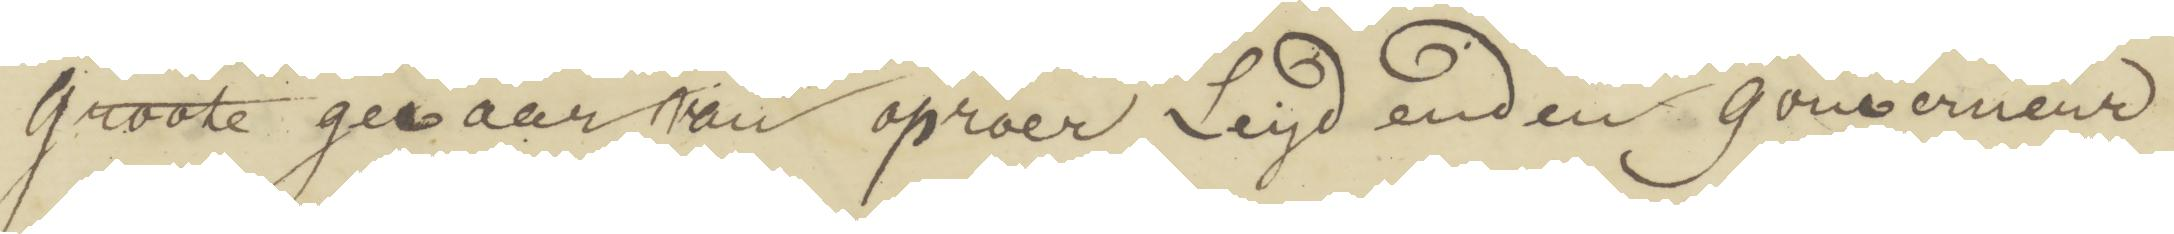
groote gevaar van oproer Leijd enden gouverneur
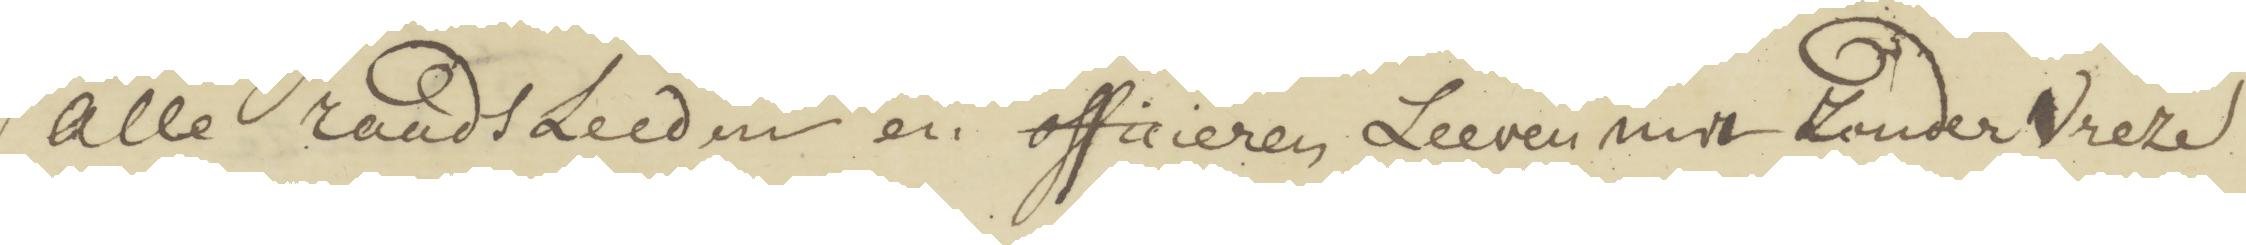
alle raadsleeden en officieren Leeven niet zonder vreze
